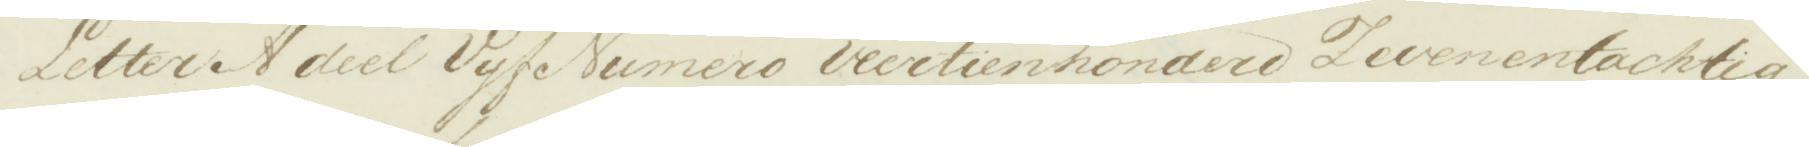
Letter A deel Vyf Numero veertienhonderd Zeven en tachtig,
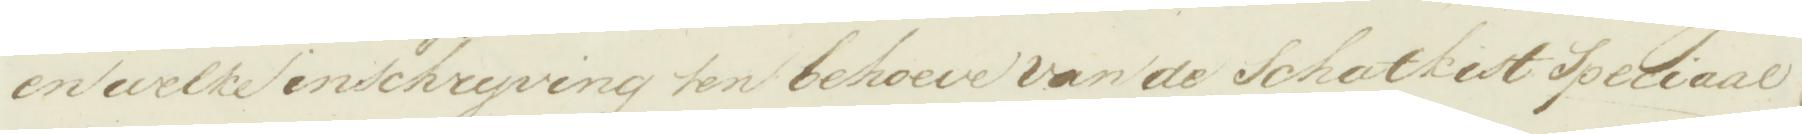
en welke inschryving ten behoeve van de schatkist speciaal
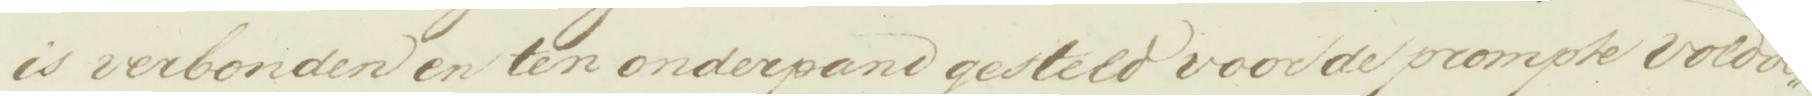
is verbonden en ten onderpand gesteld voor de prompte voldoe„
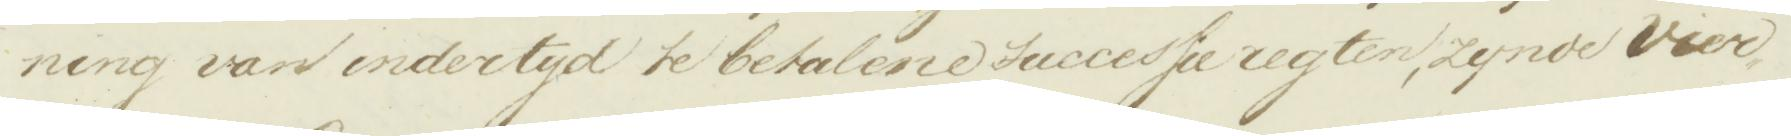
ning van indertijd te betalene successie regten, zynde vier„
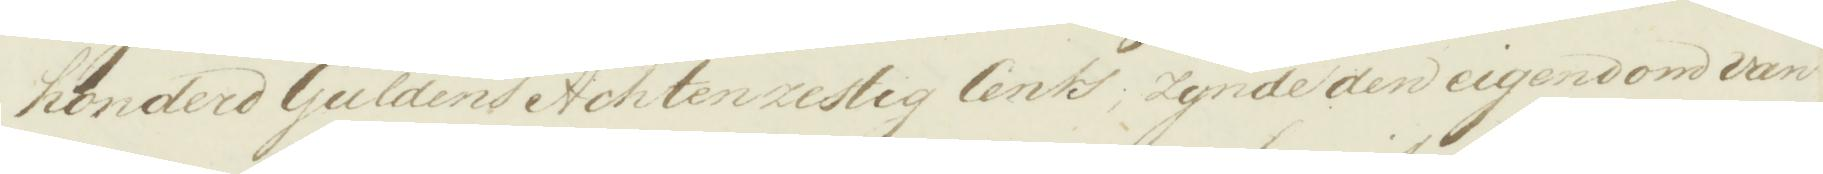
honderd Guldens Achten zestig Cents; zynde den eigendom van
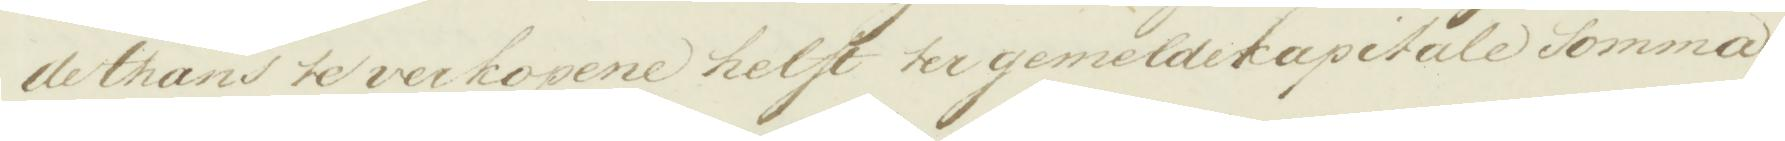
de thans te verkopene helft ter gemelde kapitale somma
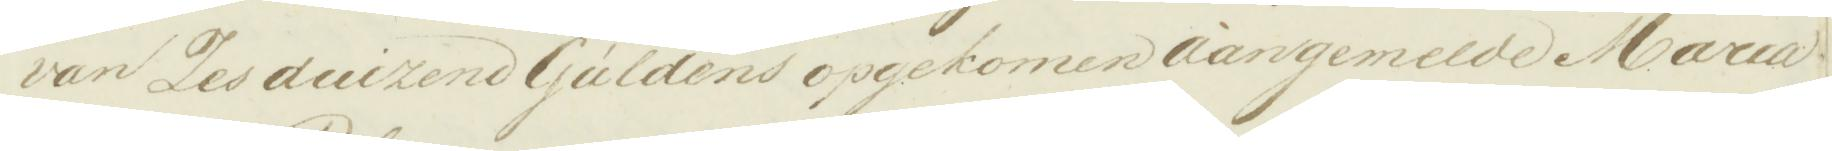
van Zes duizend Guldens opgekomen aan gemelde Maria
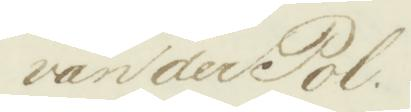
van der Pol.
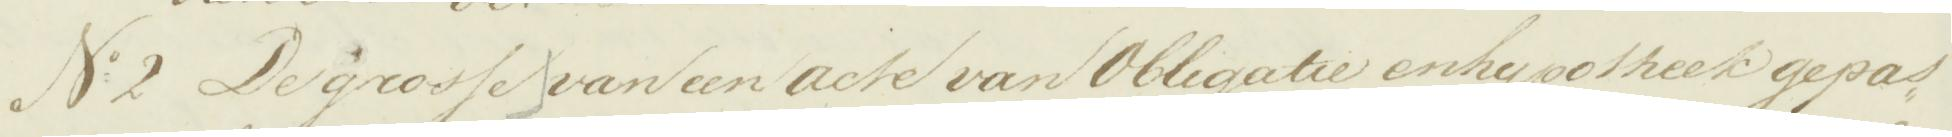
N: 2 De grosse van een acte van Obligatie en hypotheek gepas„
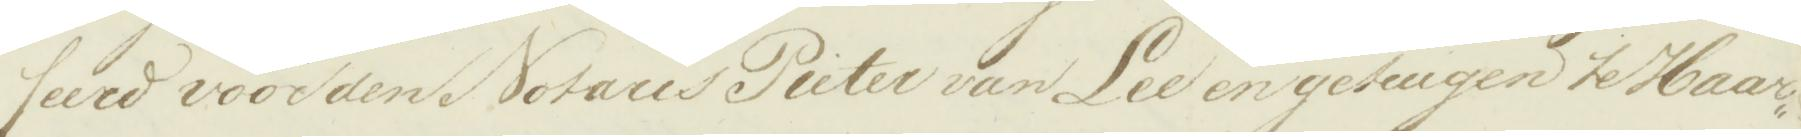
seerd voor den Notaris Pieter van Lee en getuigen te Haar„
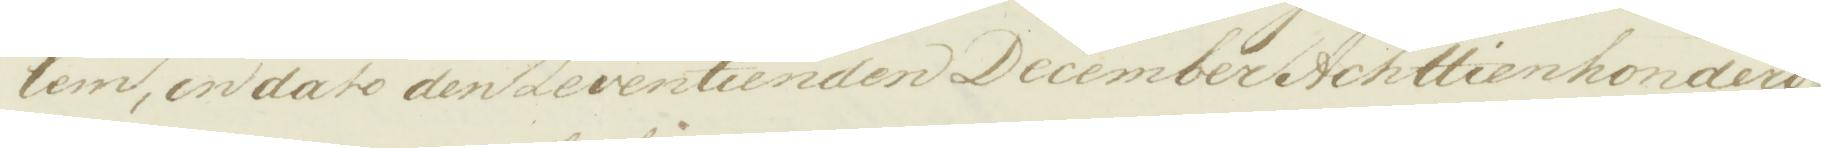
lem, in dato den Zeventienden December Achttienhonderd
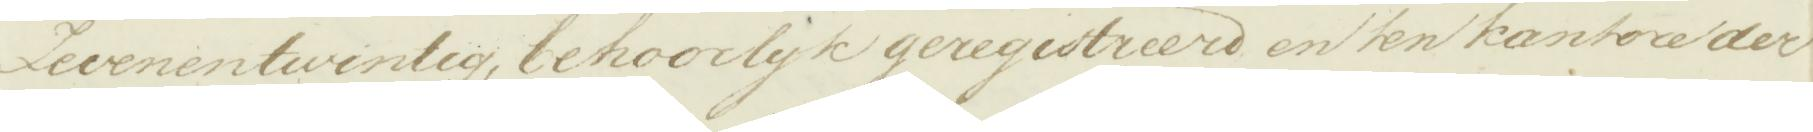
Zevenentwintig, behoorlyk geregistreerd, en ten kantore der
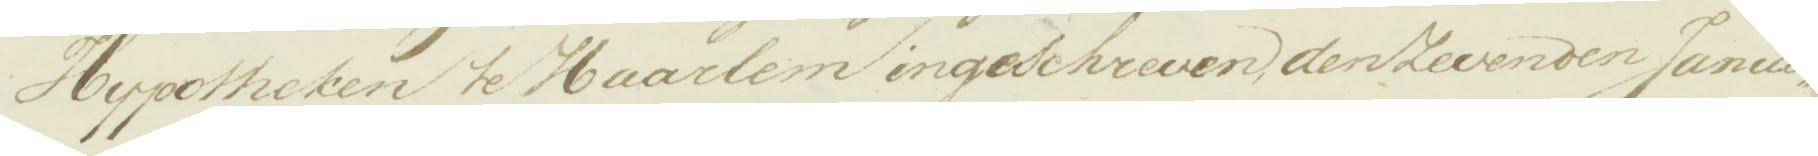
Hypotheken te Haarlem ingeschreven, den Zevenden Janua„
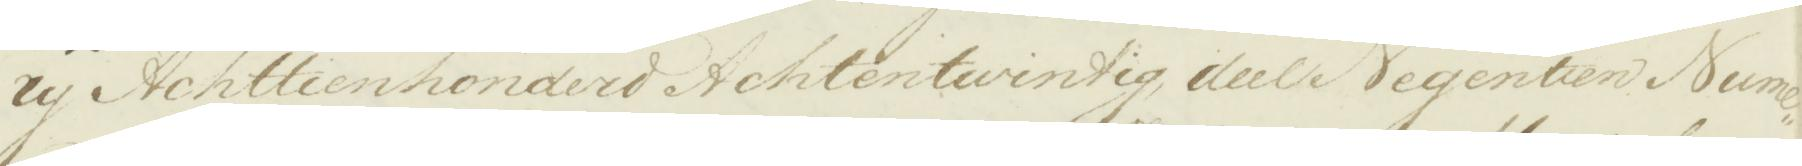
ry Achttienhonderd Achtentwintig, deel Negentien Nume„
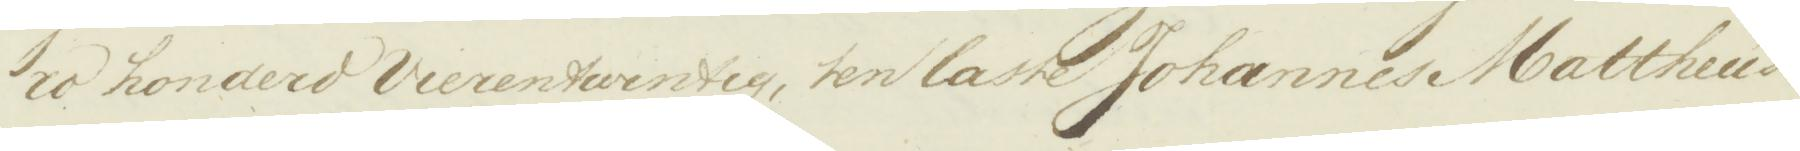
ro honderd Vierentwintig, ten laste Johannes Mattheus
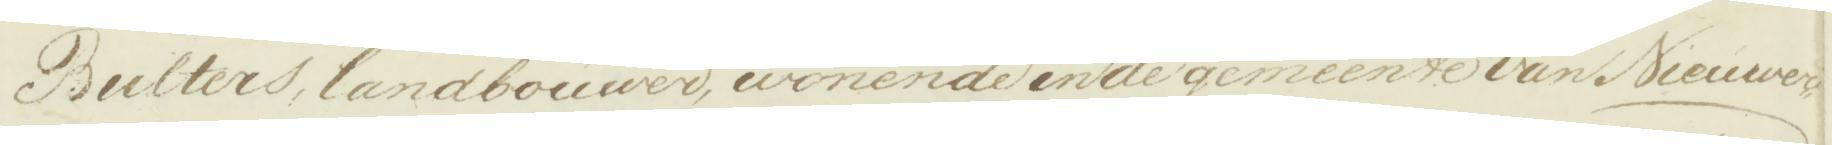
Bulters, landbouwer, wonende in de gemeente van Nieuwer
